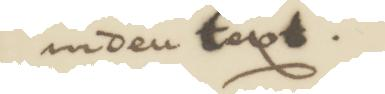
in den text.
